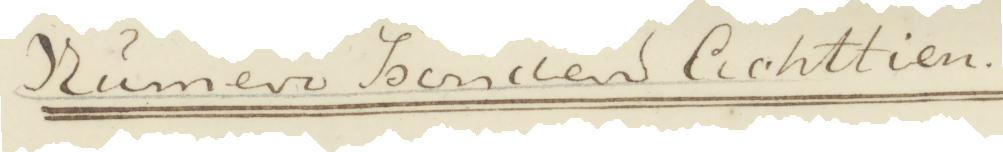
Numero honderd Achttien.
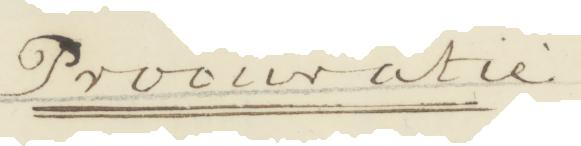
Procuratie:
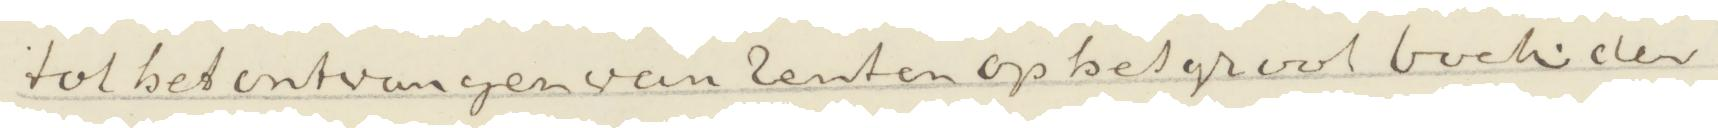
tot het ontvangen van Renten op het grootboek der
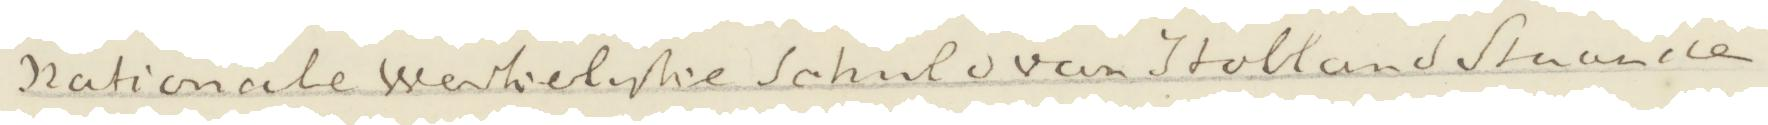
Nationale Werkelyke Schuld van Holland Staande
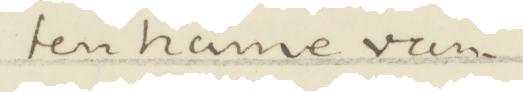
ten name van
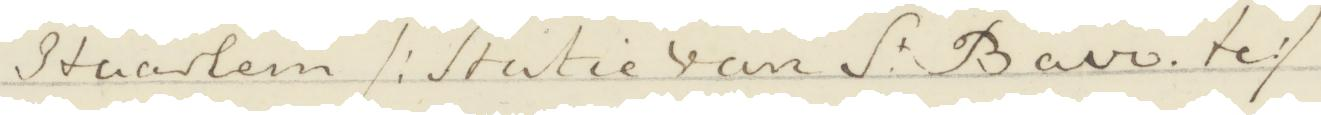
Haarlem /: Statie van S.t Bavo. te :/
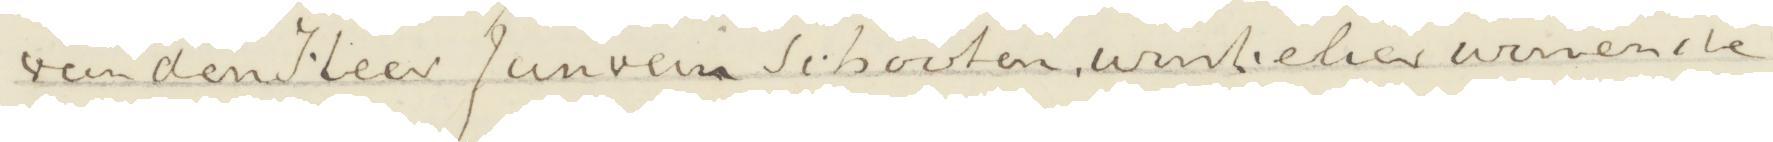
van den Heer Jan van Schooten, winkelier wonende
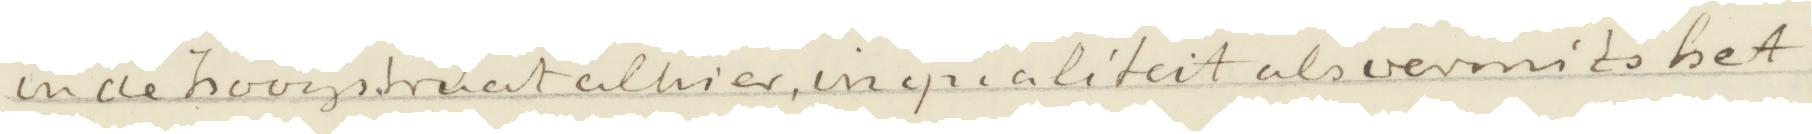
in de hoogstraat alhier, in qualiteit als vermits het
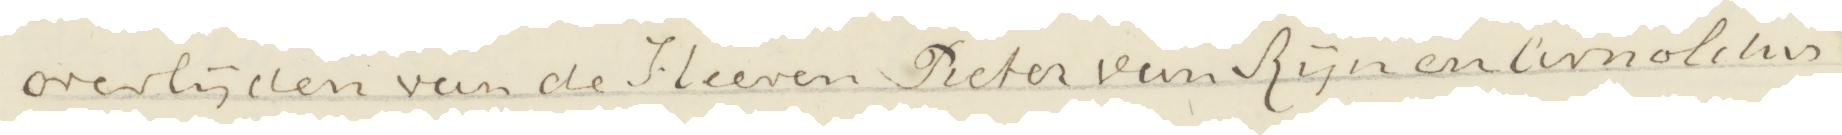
overlijden van de Heeren Pieter van Rijn en Arnoldus
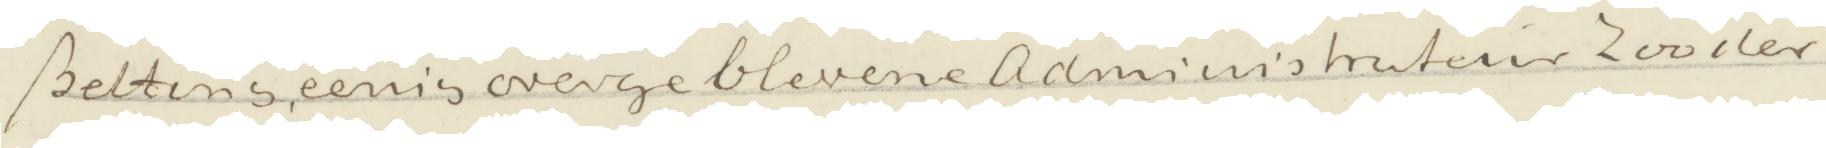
Belting eenig overgeblevene Administrateur Zoo der
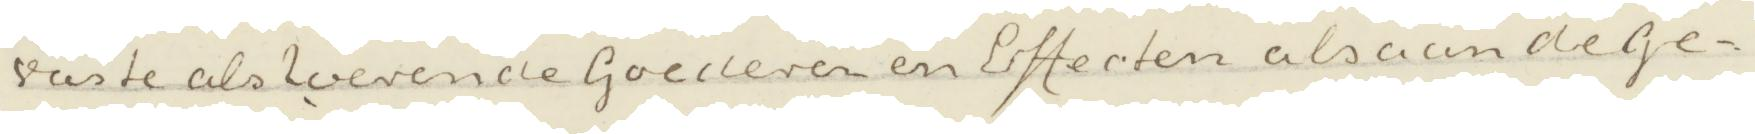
vaste als roerende Goederen en Effecten als aan de Ge=
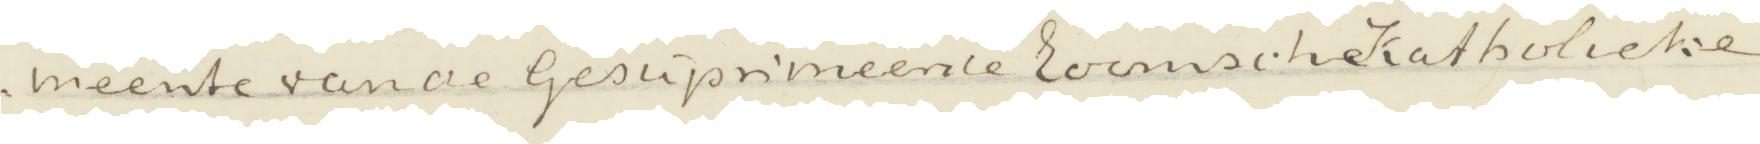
-meente van de Gesuprimeerde Roomsch Katholieke
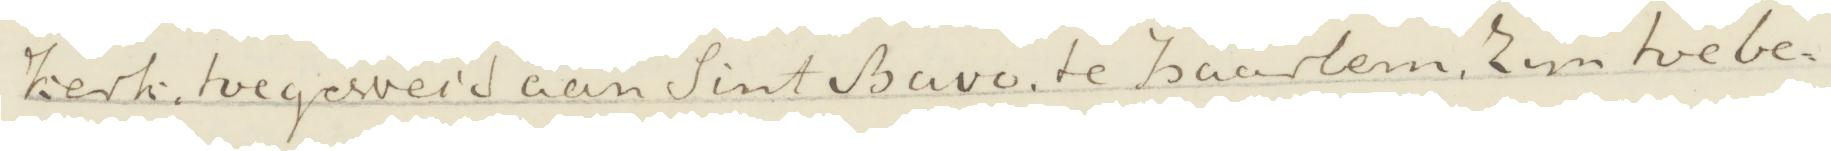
kerk, toegeweid aan Sint Bavo, te haarlem, Zijn toebe=
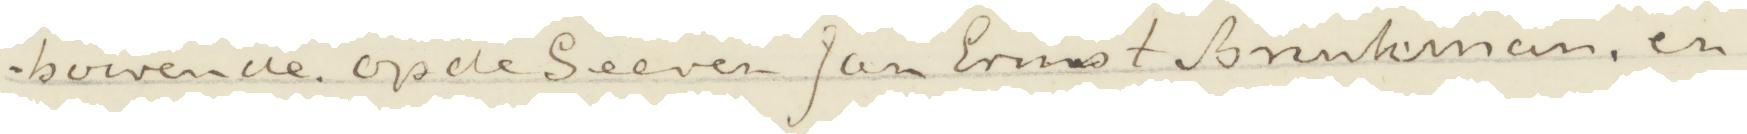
=hoorende op de heeren Jan Ernst Brinkman, en
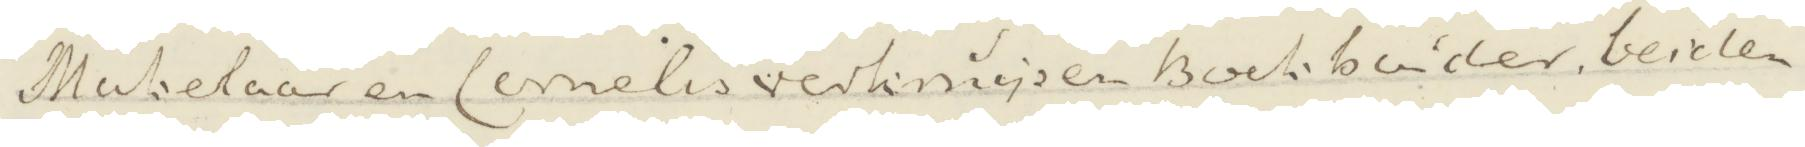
Makelaar en Cornelis Verkruijsen Boekhouder, beiden
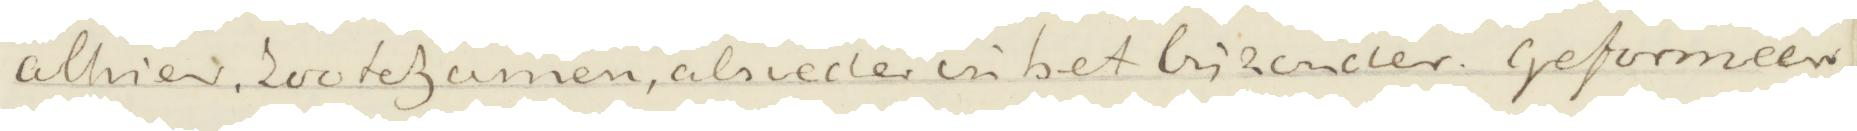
alhier, Zoo tezamen, als ieder in het bijzonder. Geformeerd
